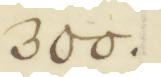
300.
